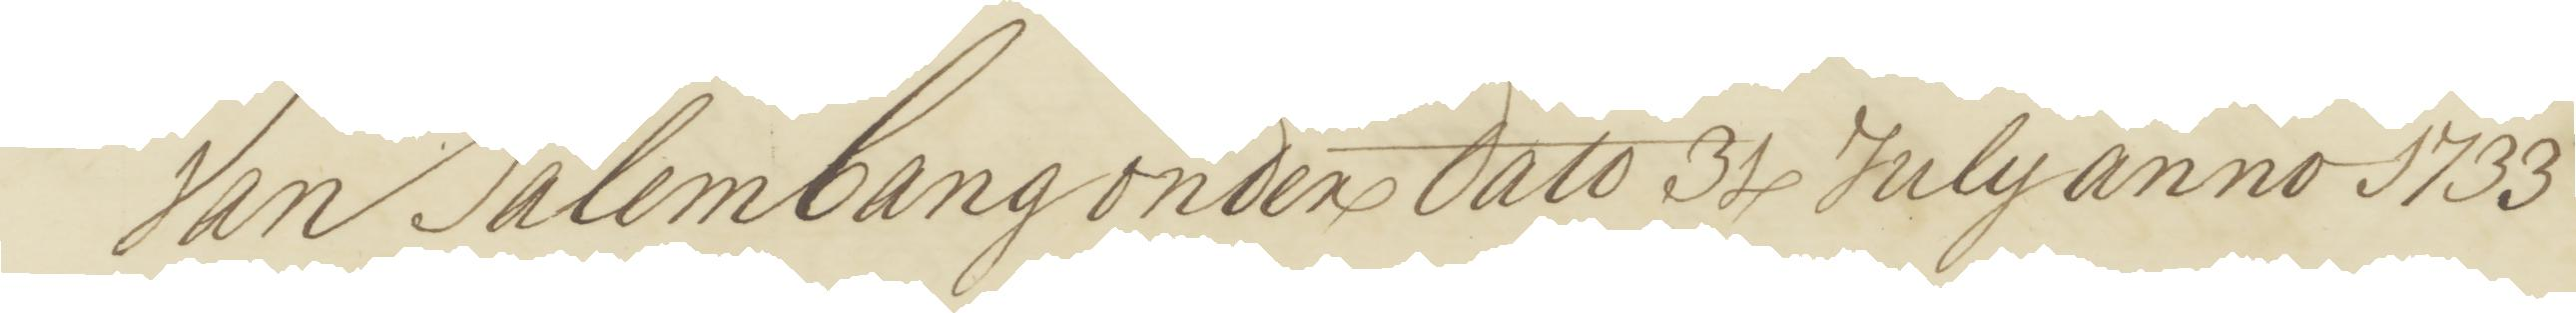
Van Palembang onder dato 34 July anno 1733
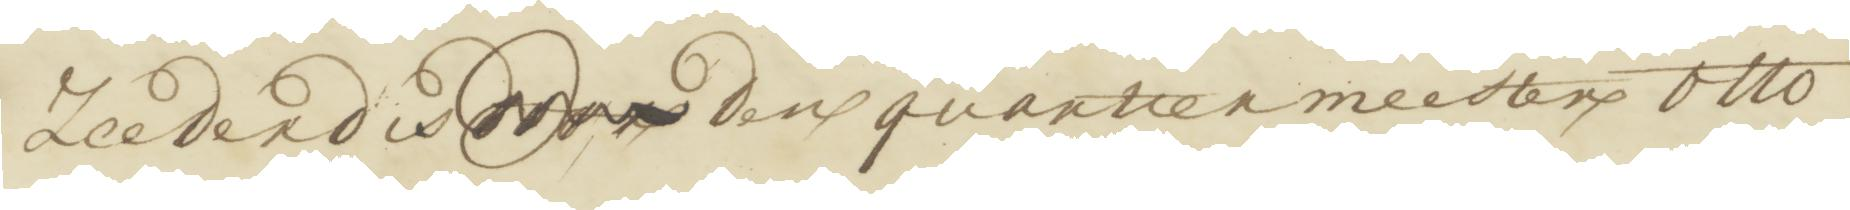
zeederd is door den quartier meester otto
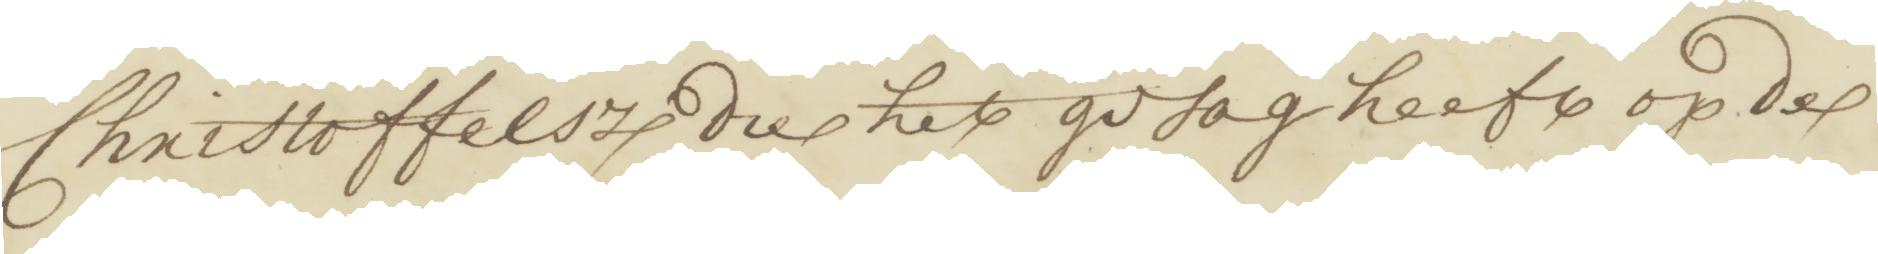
Christoffelsz die het gesag heeft op de
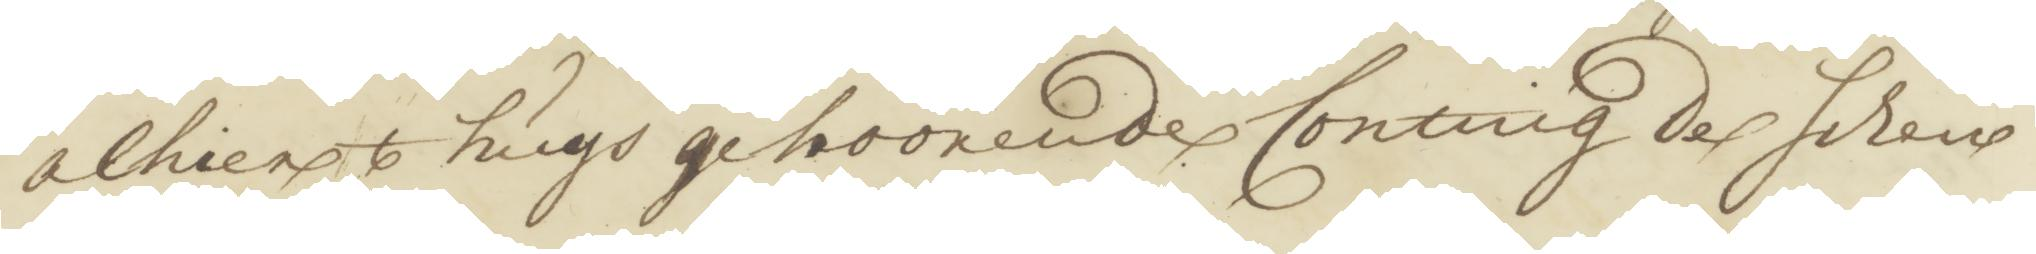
alhier t huys gehoorende Conting de schen
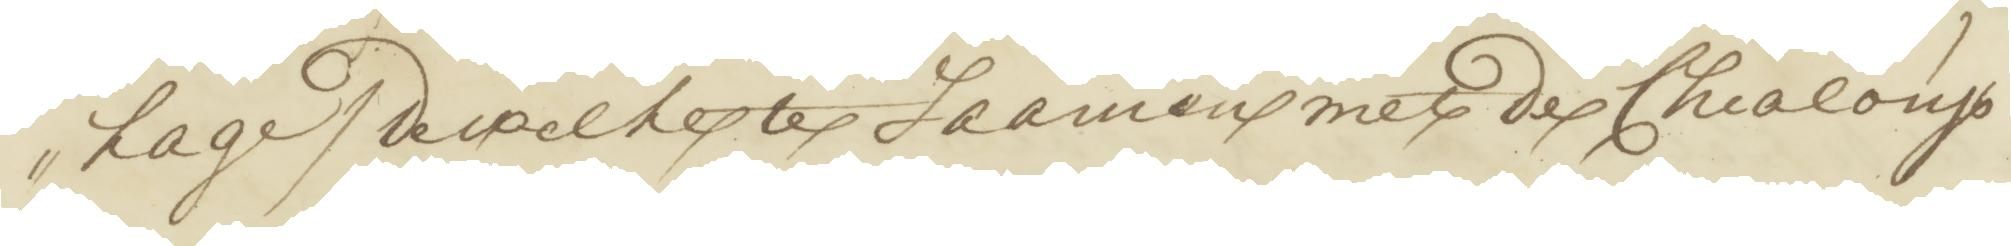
„kage / dewelke te saamen met de Chialoup
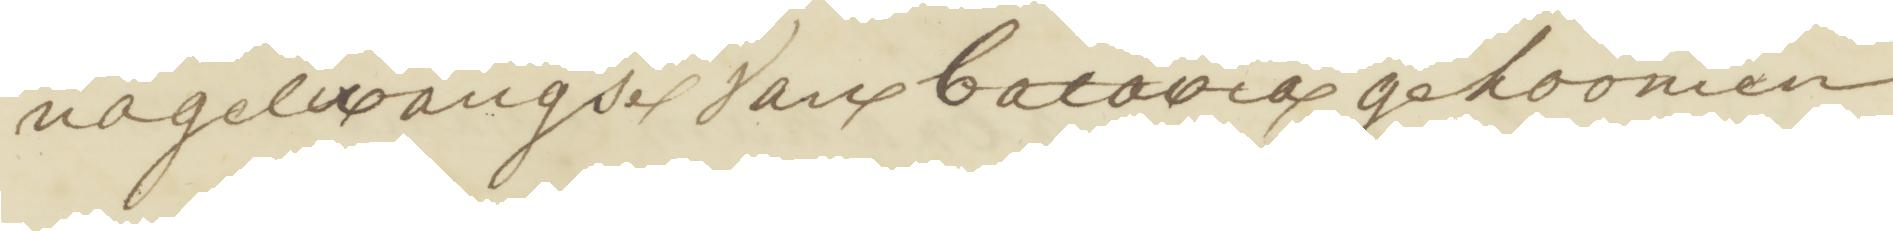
nagelwangse Van batavia gekoomen
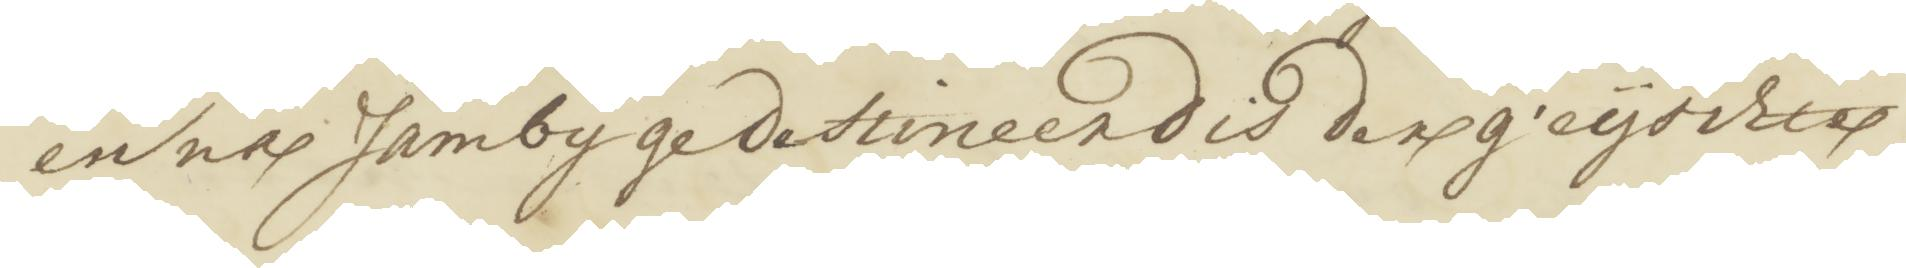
en na Jamby gedestineerd is der g’eijschte
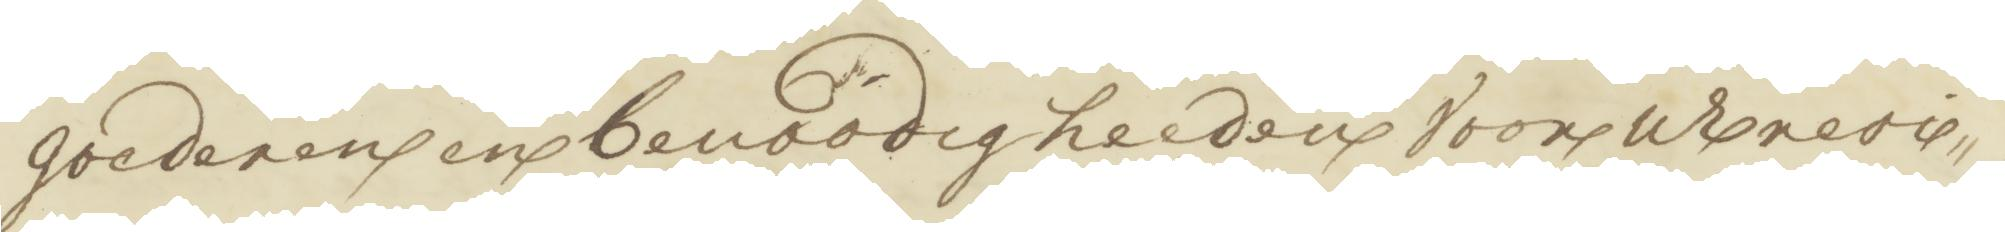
goederen en benoodigheeden Voor uE resi„
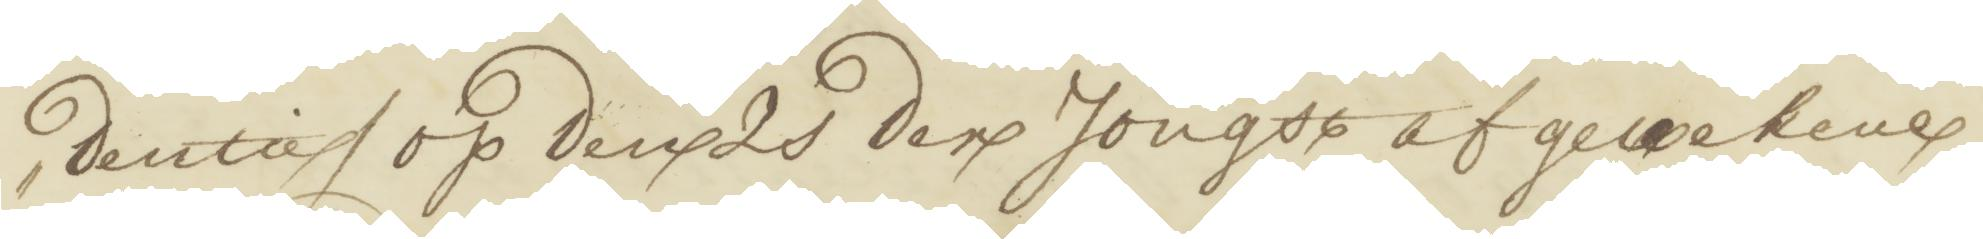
„dentie/ op den 21 der Jongst af gewekene
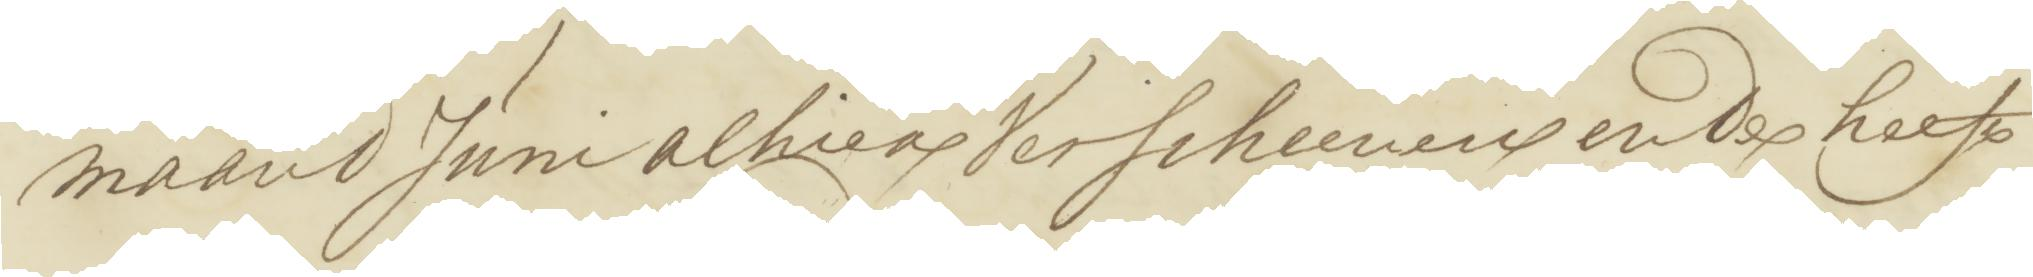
maand Juni alhier Verscheenen en de heeft
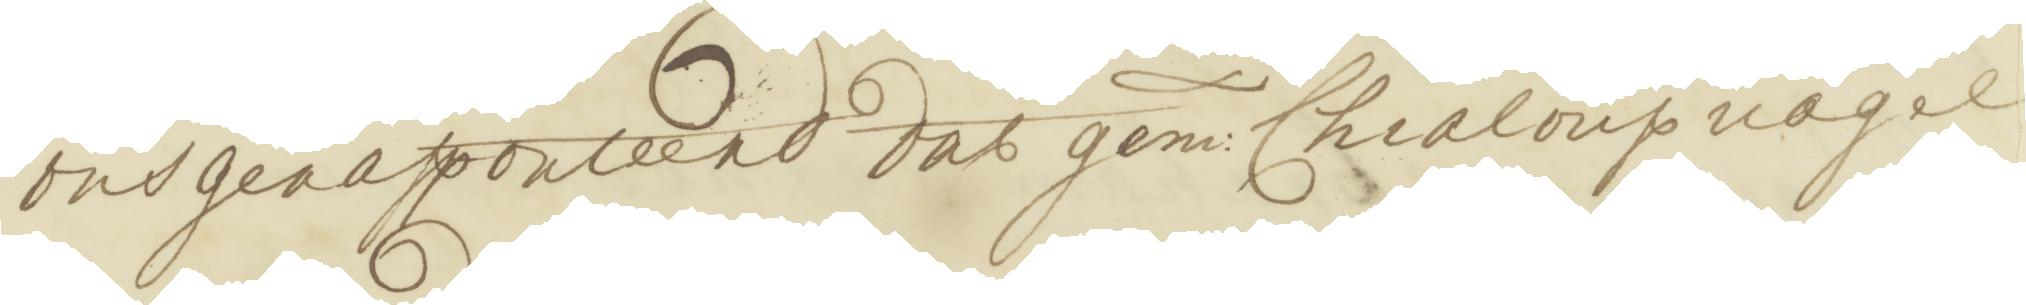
ons gerapporteerd dat gem: Chialoup nagel
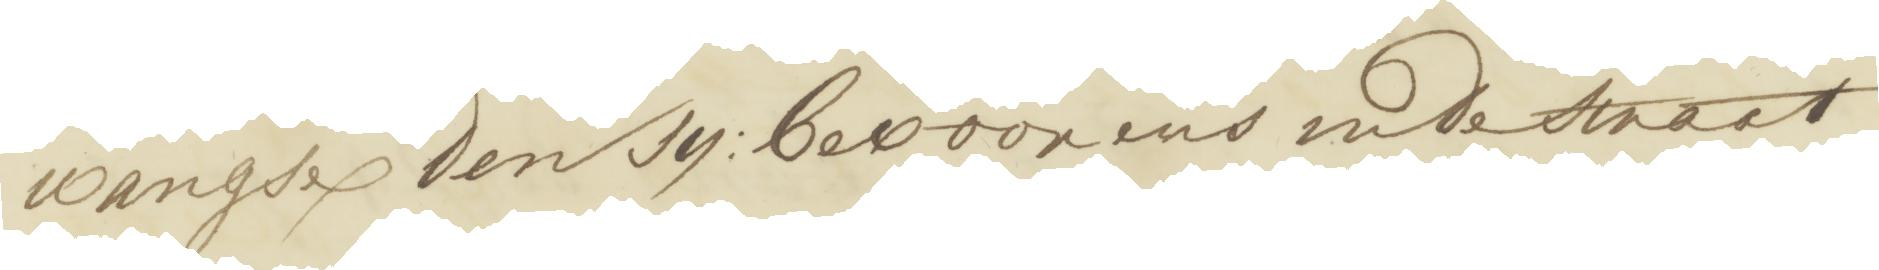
wangse den 18: bevoorens in de straet
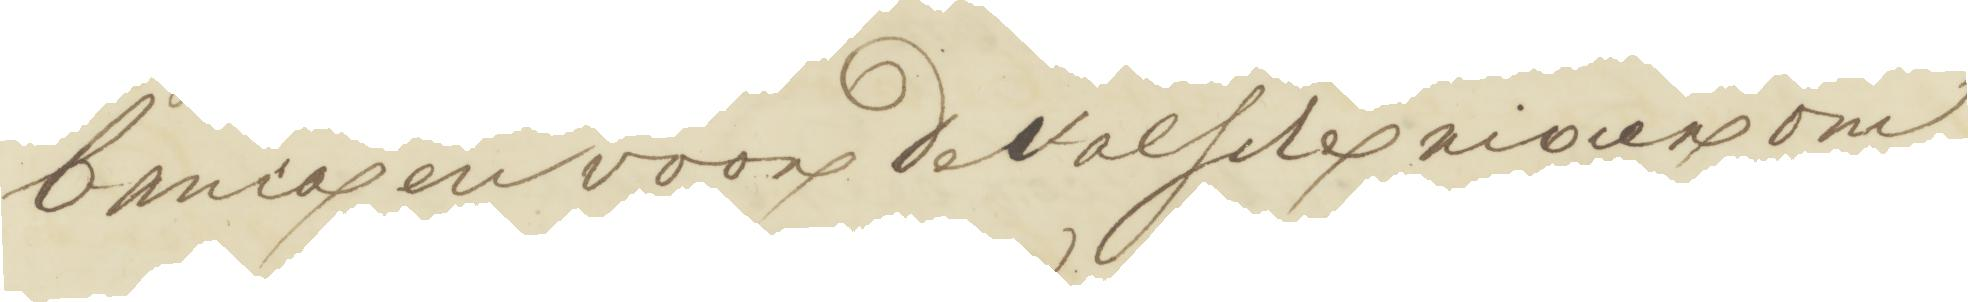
banca en voor de valsche rivier om
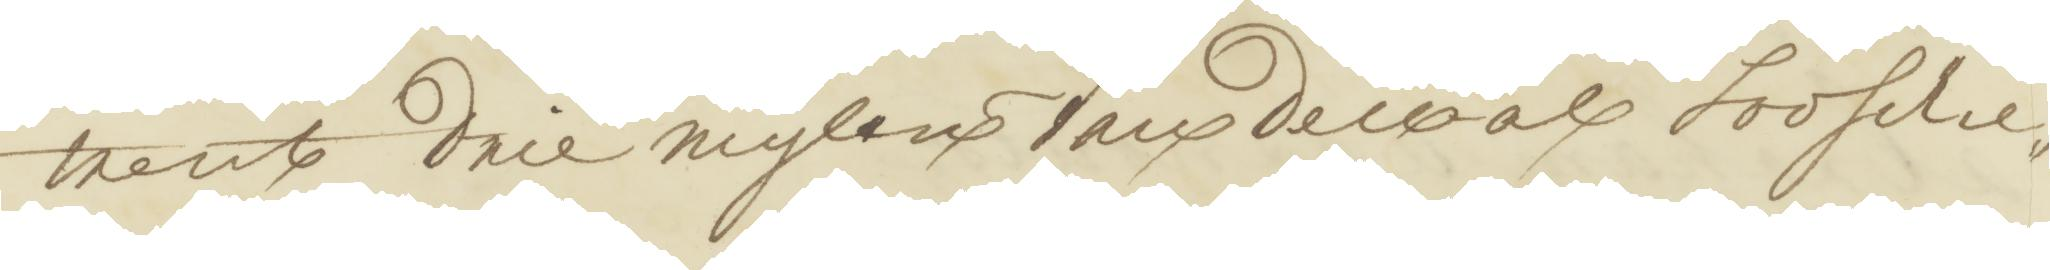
trent drie mylen Van dewal sooschie„
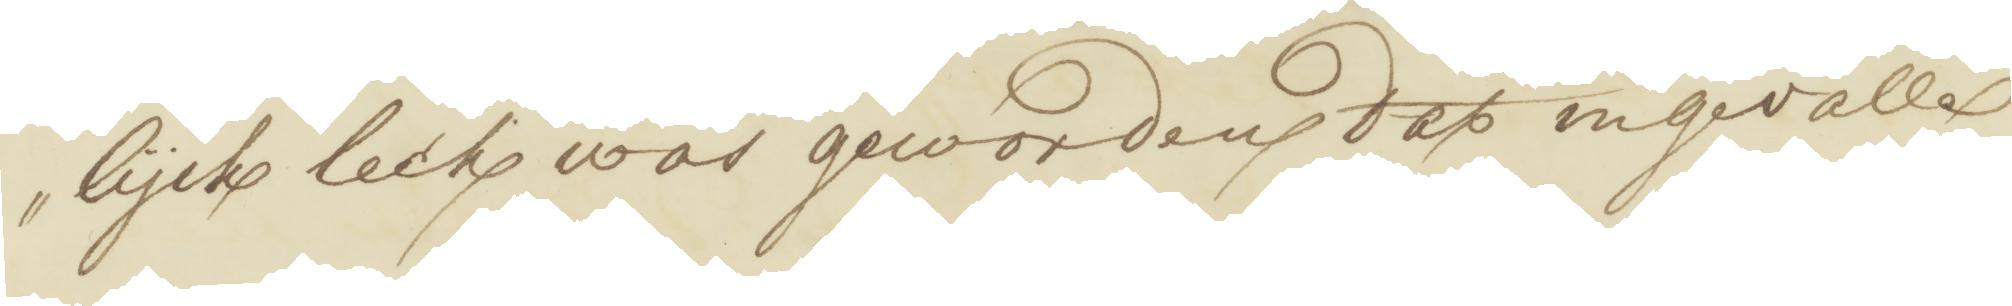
„lijck leck was geworden dat ingevalle
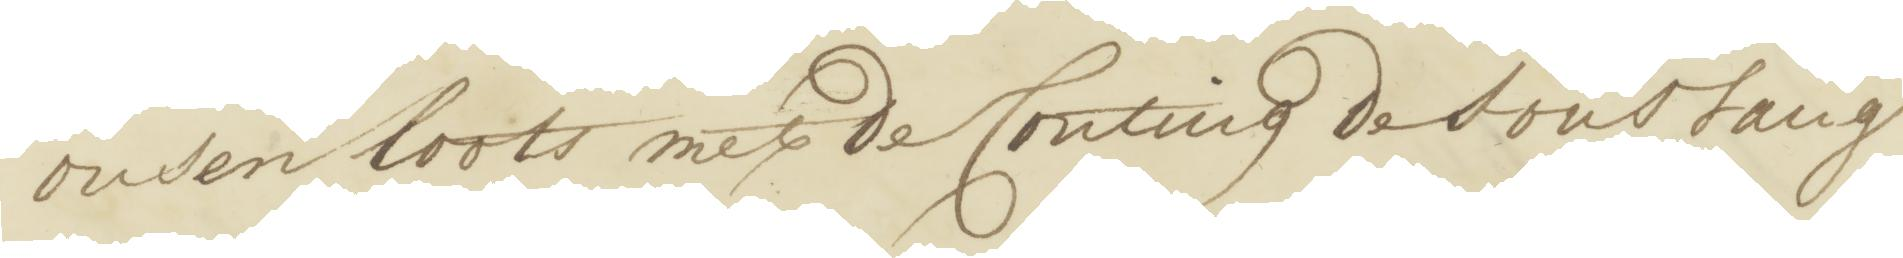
onsen loots met de Conting de soustang
